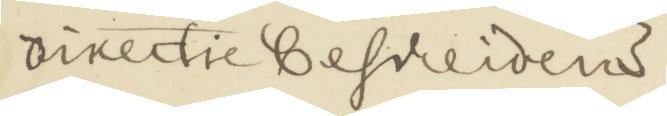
directie bescheidene
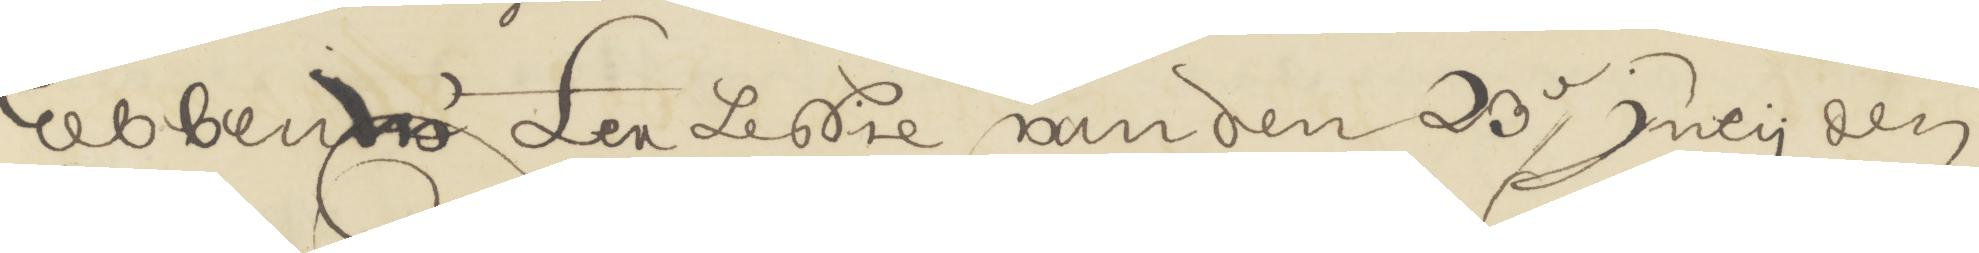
hebben ter sessie van den 23„e julij den
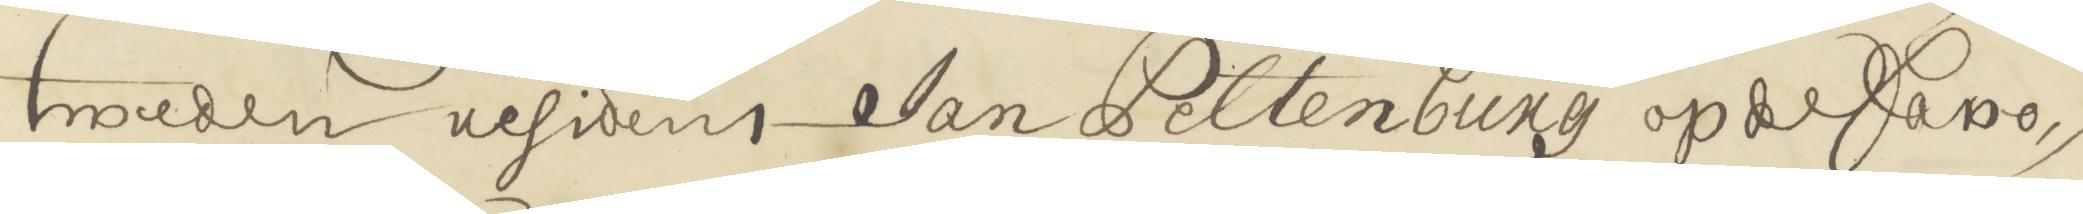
tweden resident van Peltenburg op de favo„
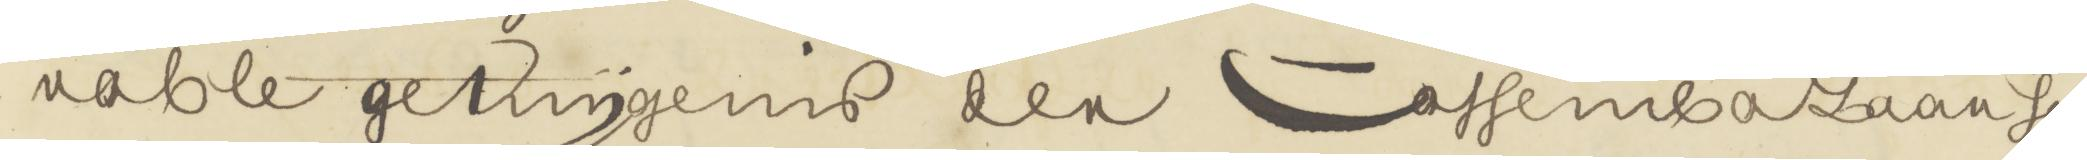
rable getuijgenis der Cassembazaarse
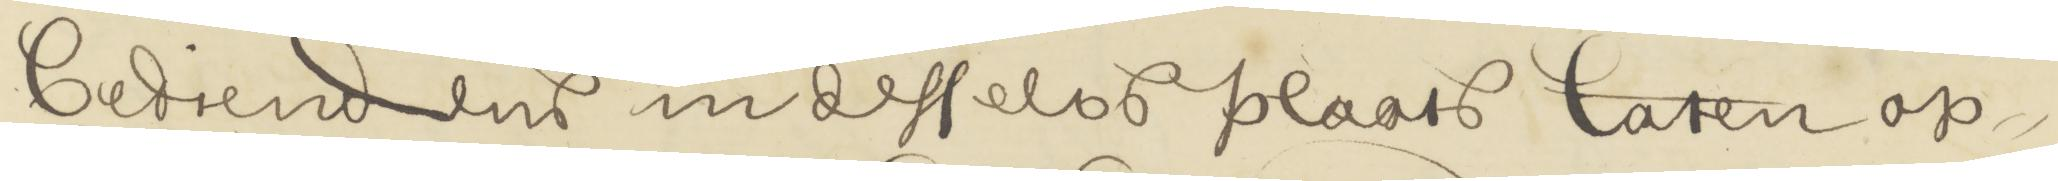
bediendens in desselvs plaats laten op„
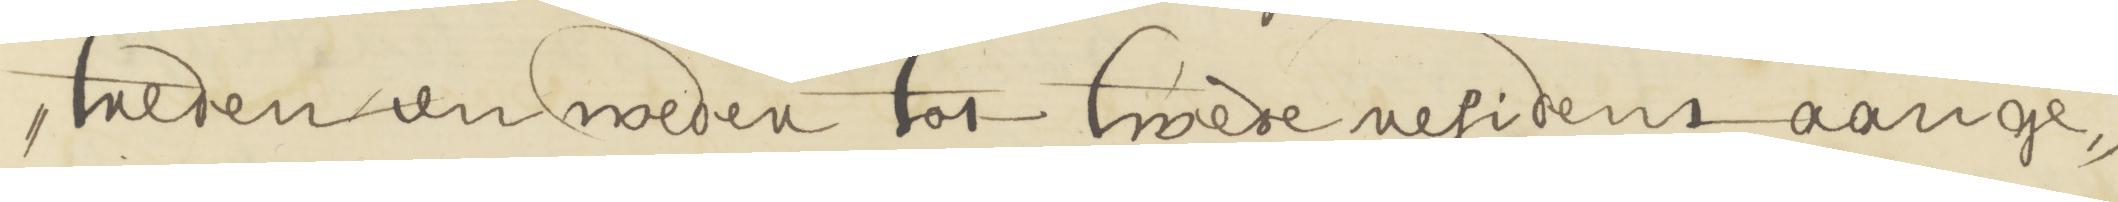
„treden en weder tot twede resident aange„
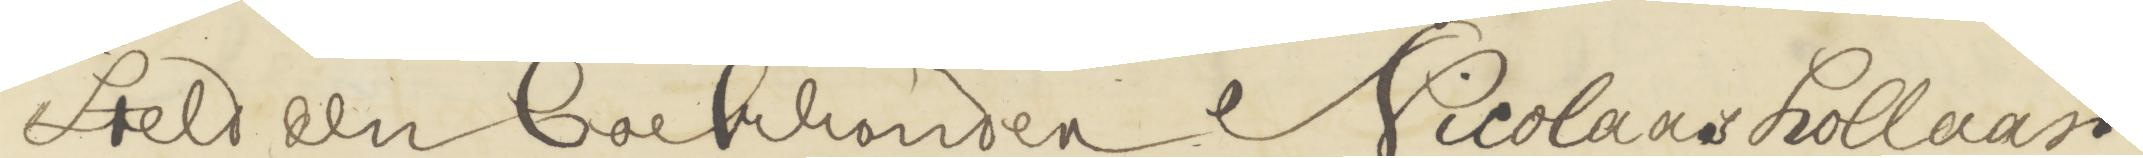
steld den boekhonder Nicolaas hollaar
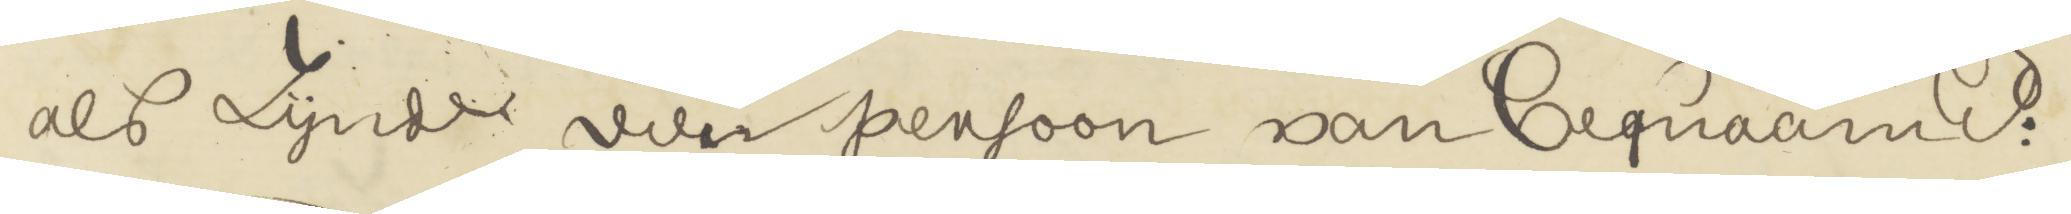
als zijnde een persoon van bequaamdh:d
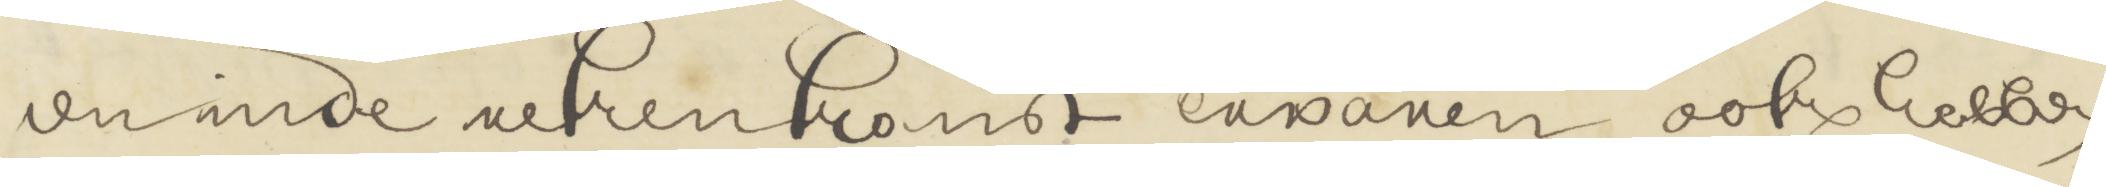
en inde rekenkonst ervaren ook hebben
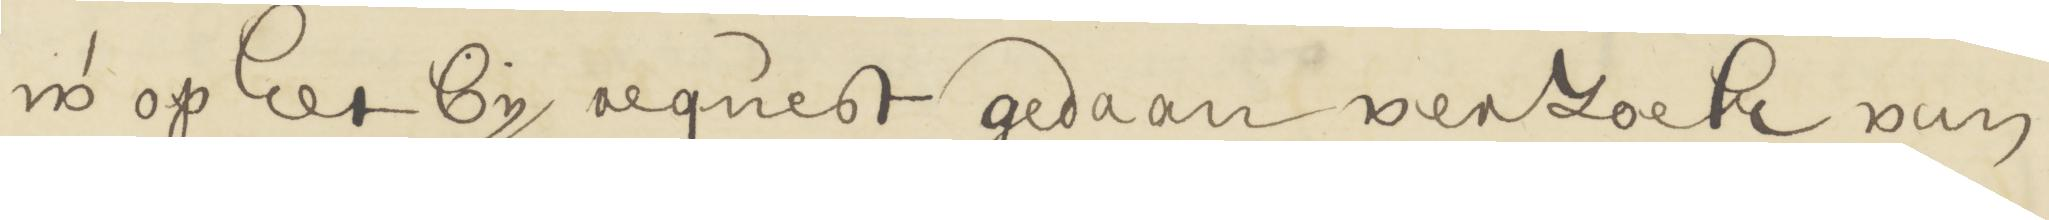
w' op het bij request gedaan verzoek van
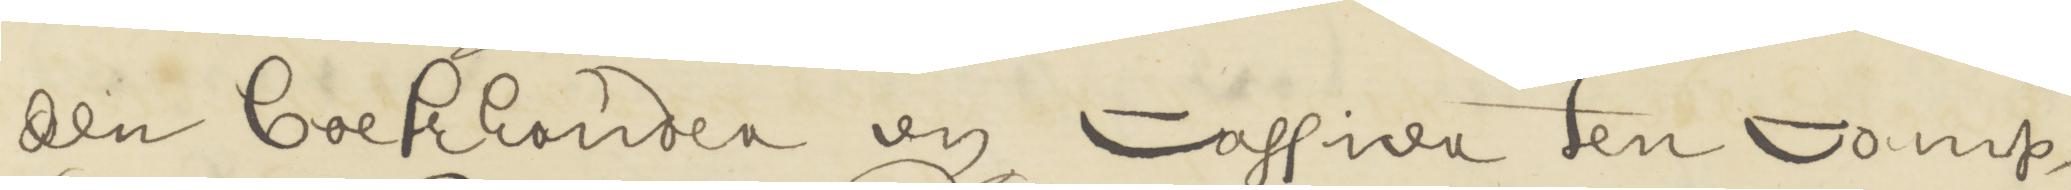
den boekhouder en Cassier ten Comp„
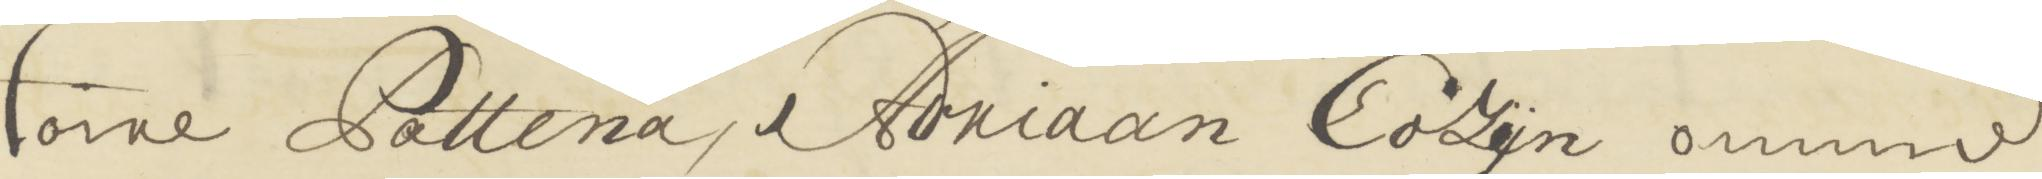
toire Pattena, Adriaan Cozijn omme
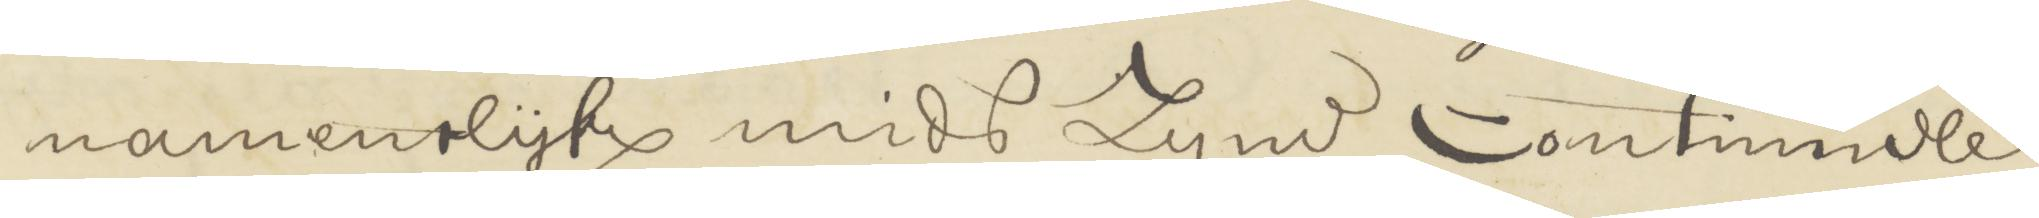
namentlijk mids zyne continuele
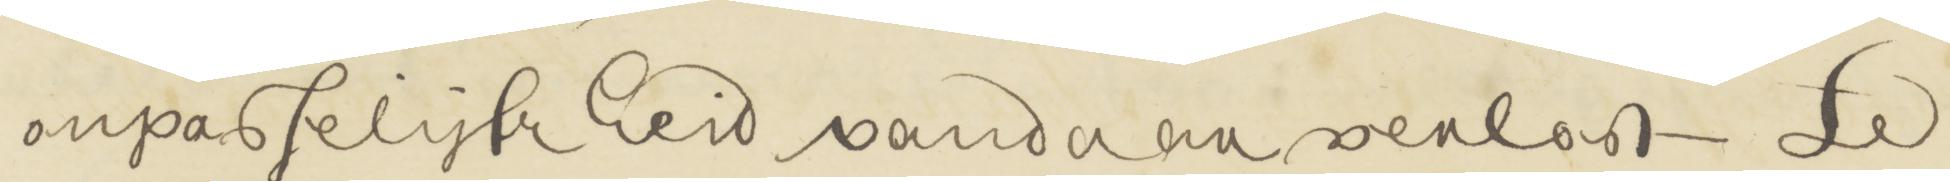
onpasselijkheid vandaar verlost te
